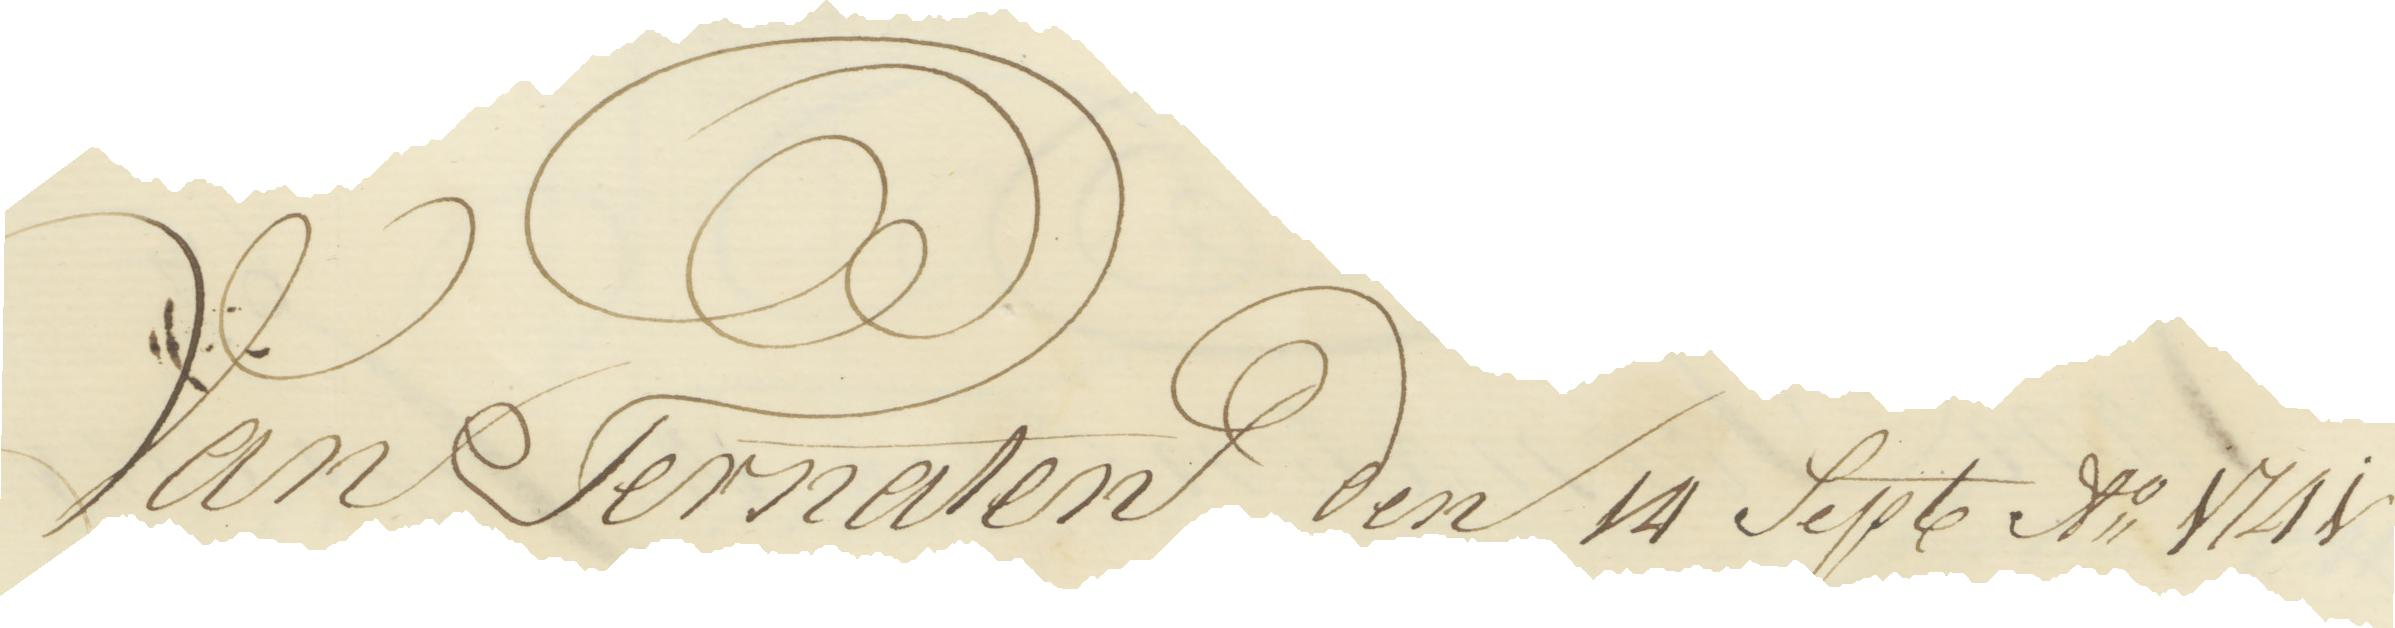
Van Ternaten den 14 Sept A„o 1741
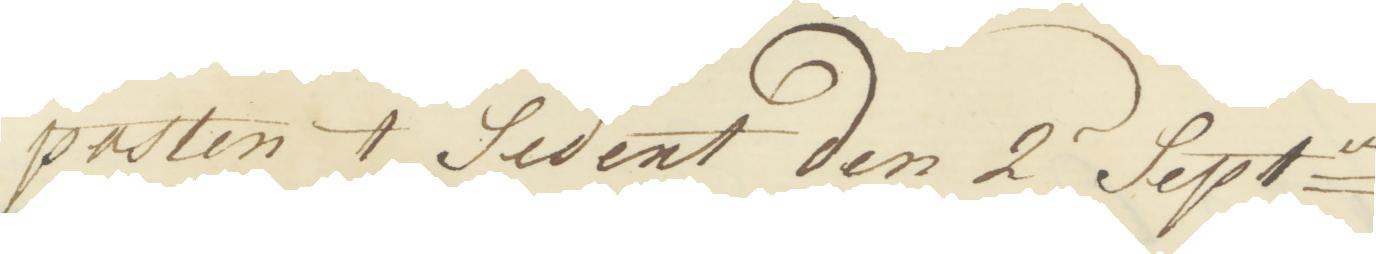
posten ’t sedert den 2' Sept=re
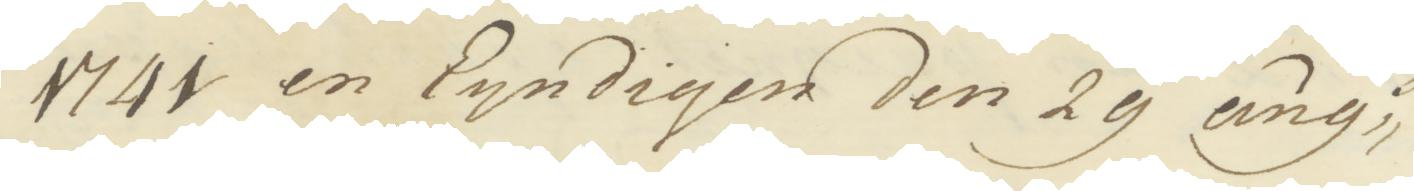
1741 en Eyndigen den 29 aug„s
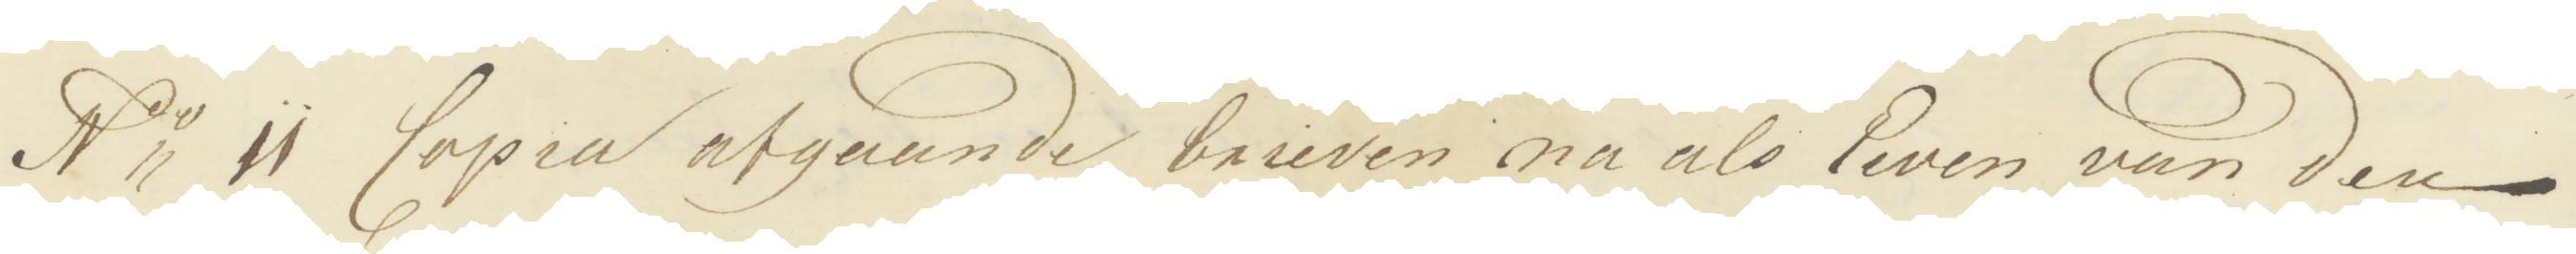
N„o 11 Copia afgaande brieven na als Eeven van den
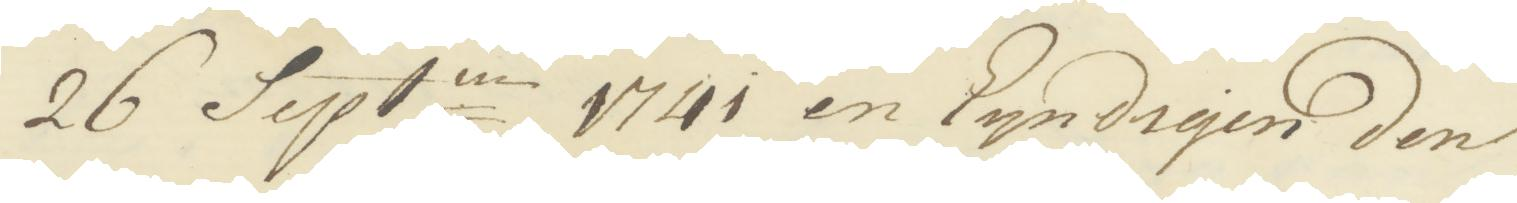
26 sept=r 1741 en Eyndigen den
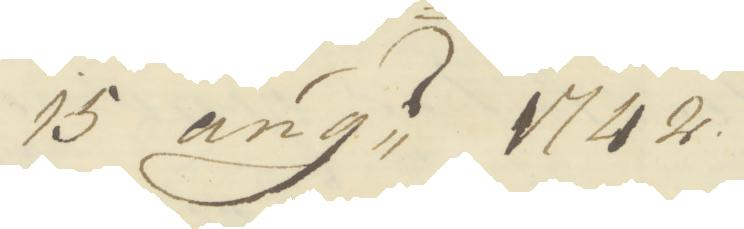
15 aug„s 1742.
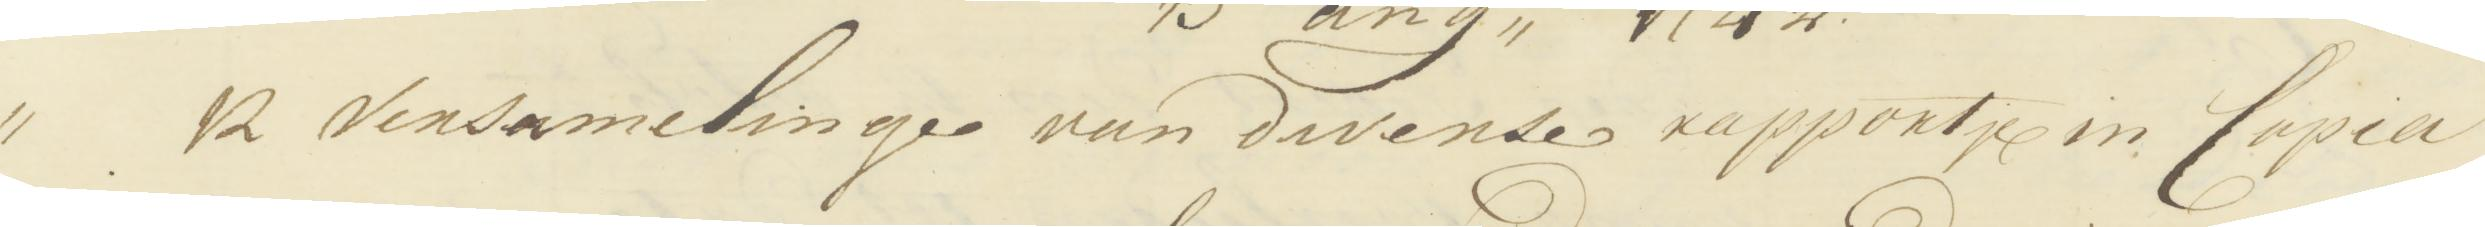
12 versamelinge van diverse rapportje in Copia
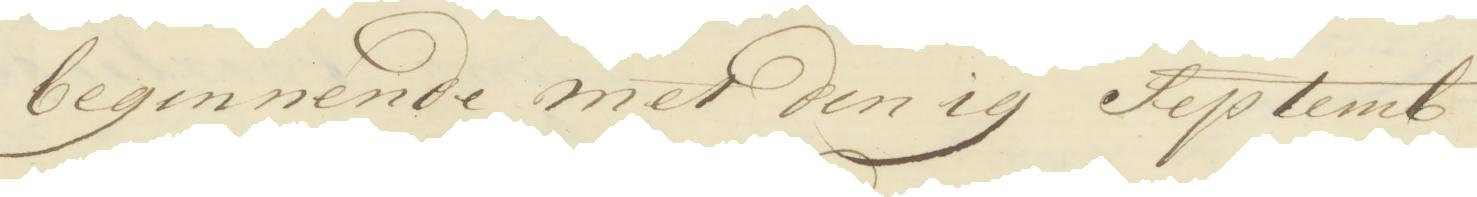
beginnende met den 19' Septemb
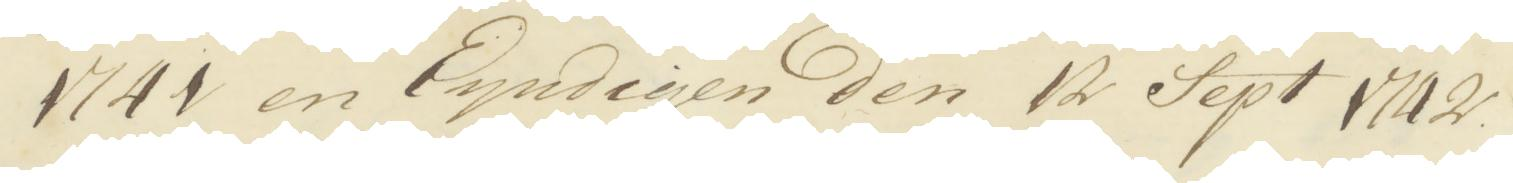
1741 en Eijndigen den 12 Sept 1742.
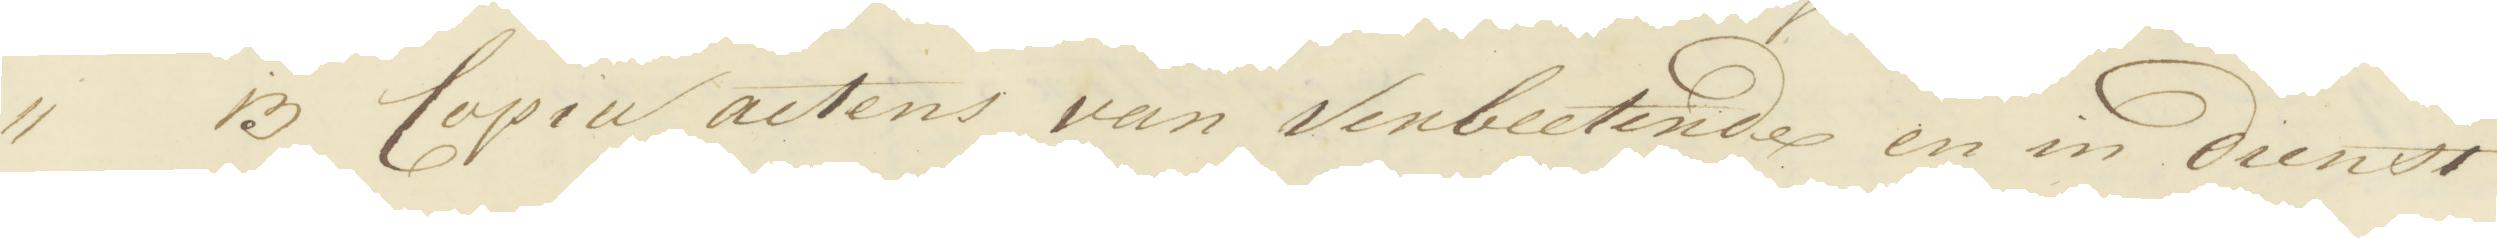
„ 13 Copia actens van verbeeterde en in dienst
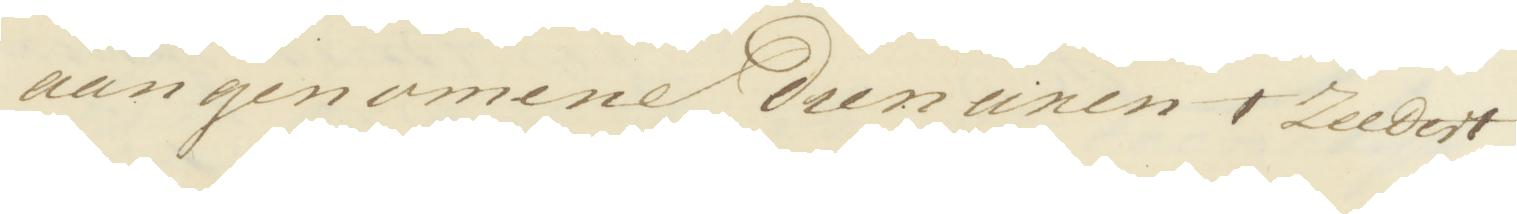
aangenomene dienaren t zeedert
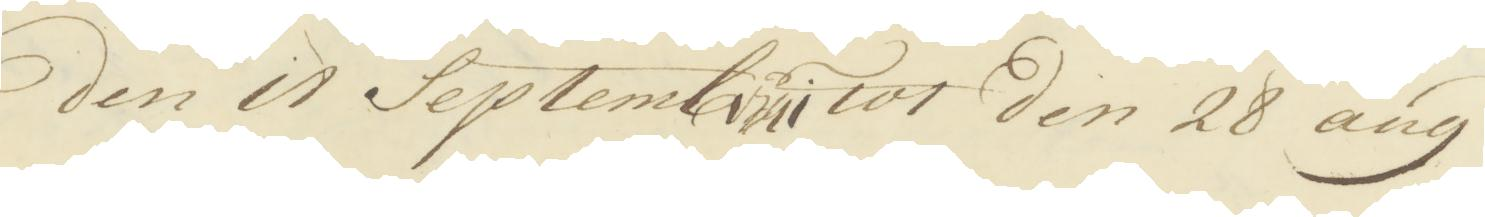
den 18 Septemb 1741 tot den 28 aug
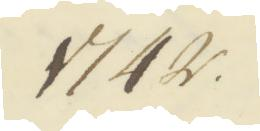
1742:
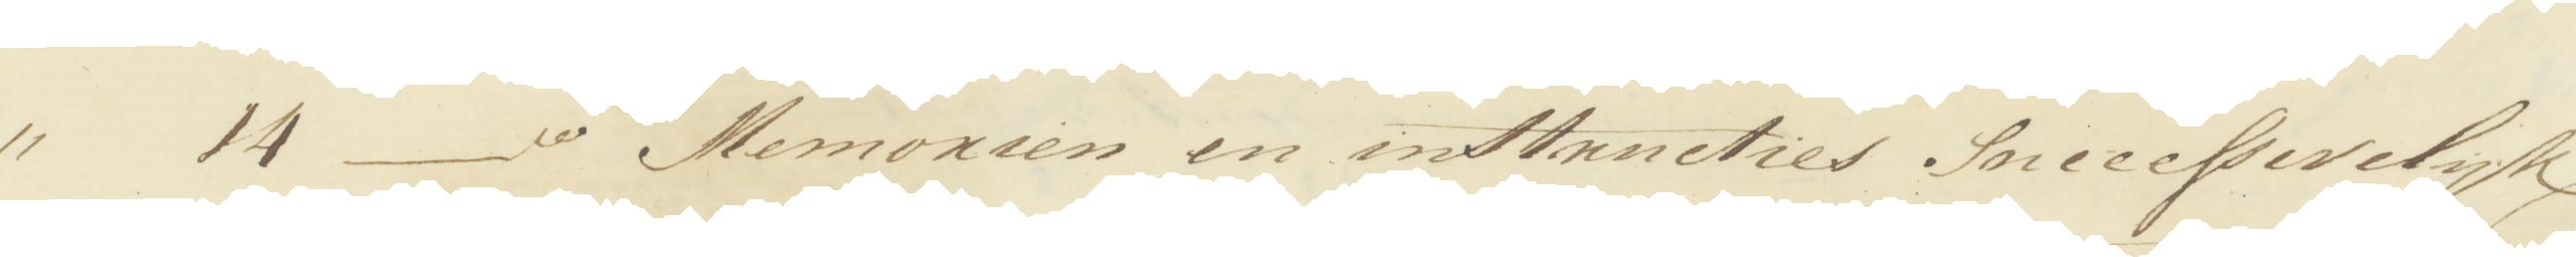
„ 14 _o Memorien en instructies successivelijk
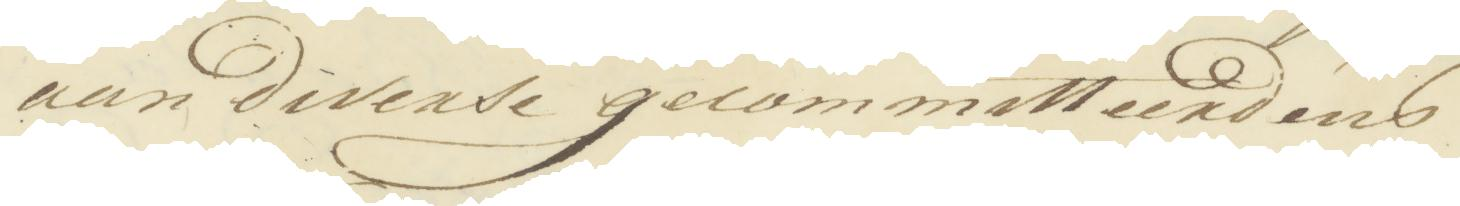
aan diverse gecommitteerdens
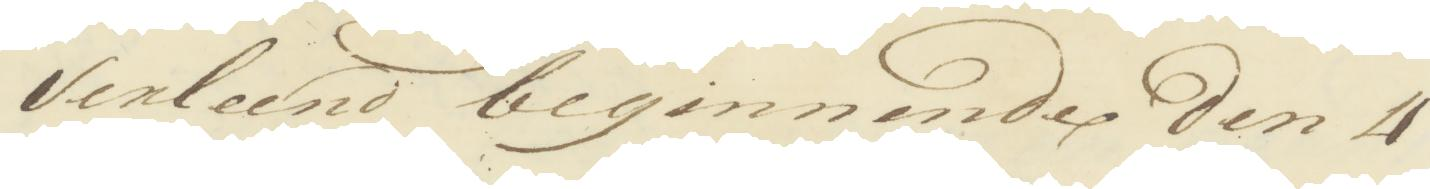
verleend beginnende den 4
